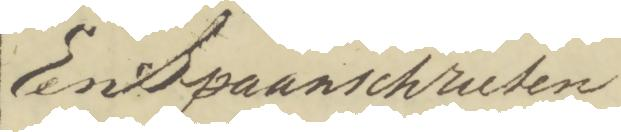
Een Spaansch rieten
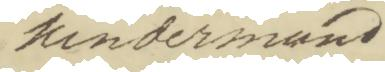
kindermand
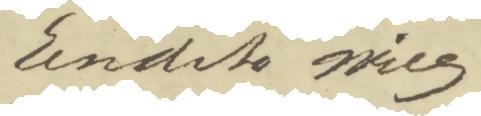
Een dito wieg
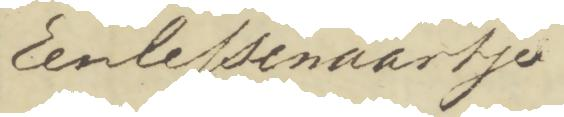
Een lessenaartje
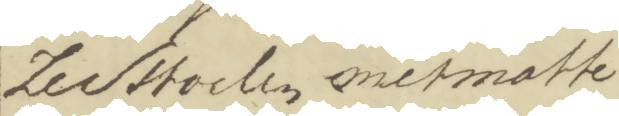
Zes stoelen met matte
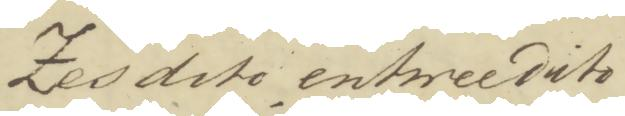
Zes dito en twee dito
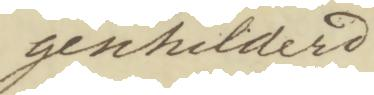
geschilderd
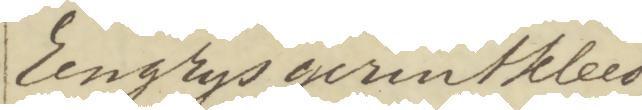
Een grys geruit kleed
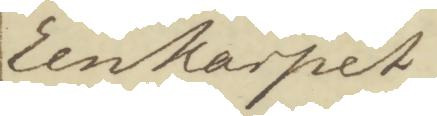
Een karpet
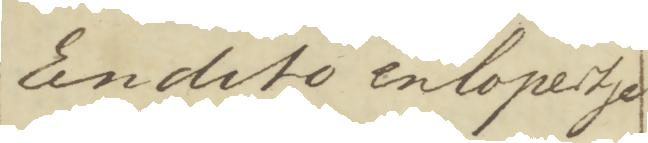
Een dito en lopertje
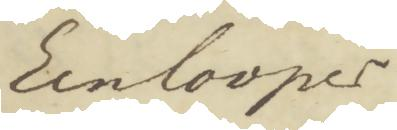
Een looper
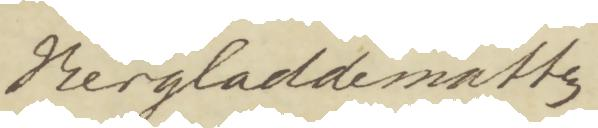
Vier gladde matten
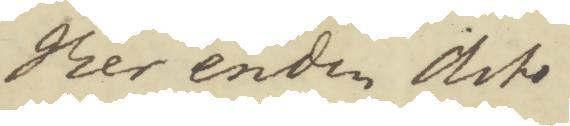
Vier enden dito
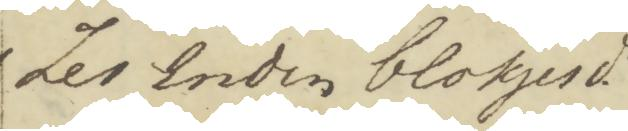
Zes Enden blokjes d.
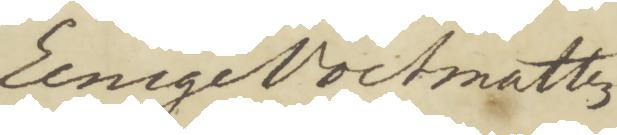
Eenige Voetmatten
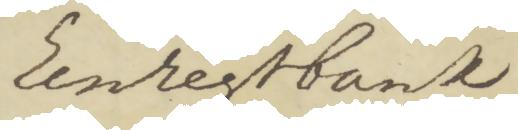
Een regtbank
